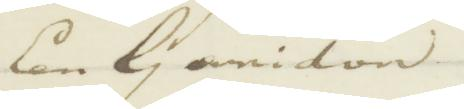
Een Garidon
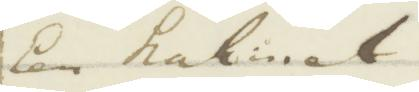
Een kabinet
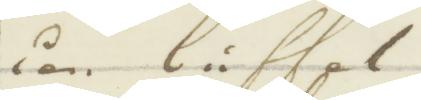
Een lussel
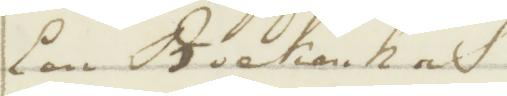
Een Boekenkas
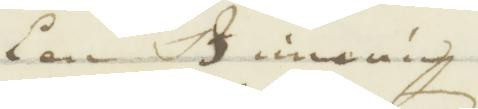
Een Bureau
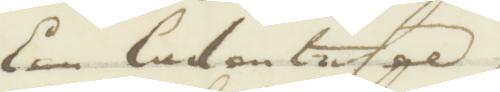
Een ladentafel
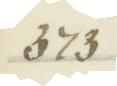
373
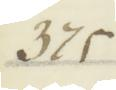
375
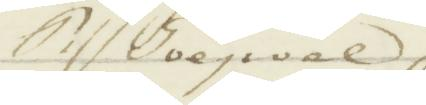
R Toepoel.
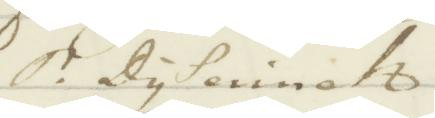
C. Dijserinck
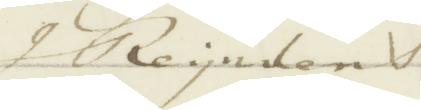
J Reijnders
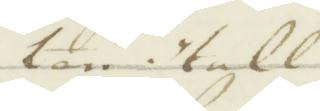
ten Hall
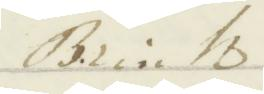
Brink
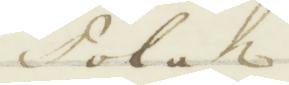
Polak
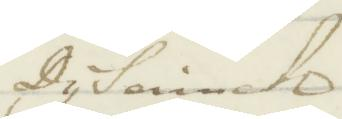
Dijserinck
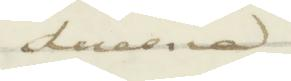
dezele
